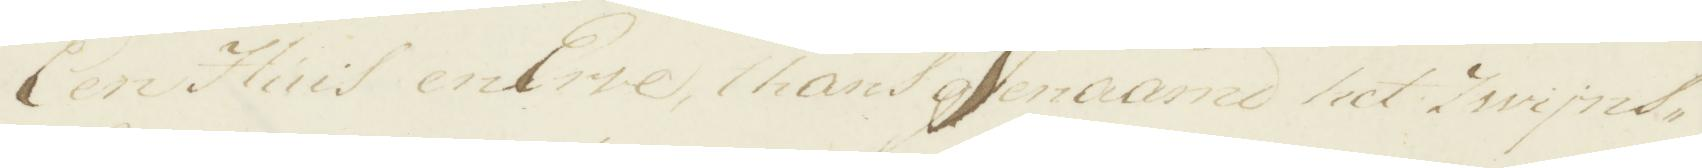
Een Huis en Erve, thans genaamd het Zwijns„
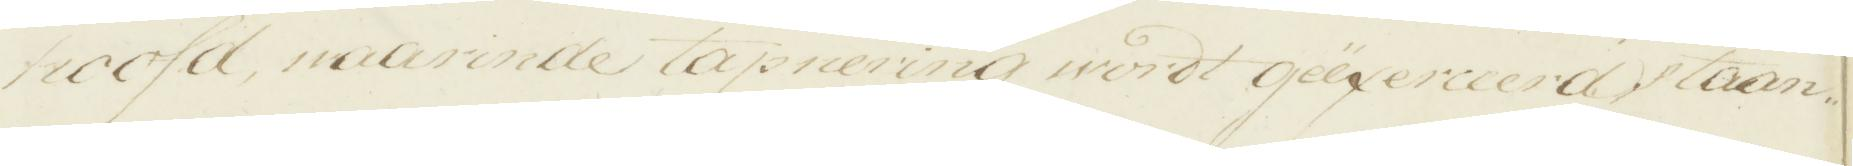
hoofd, waarin de tapnering wordt geëxerceerd staan„
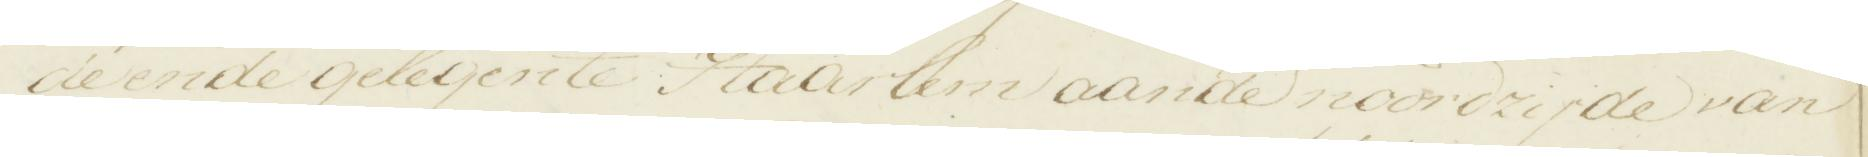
de ende gelegen te Haarlem aan de noordzijde van
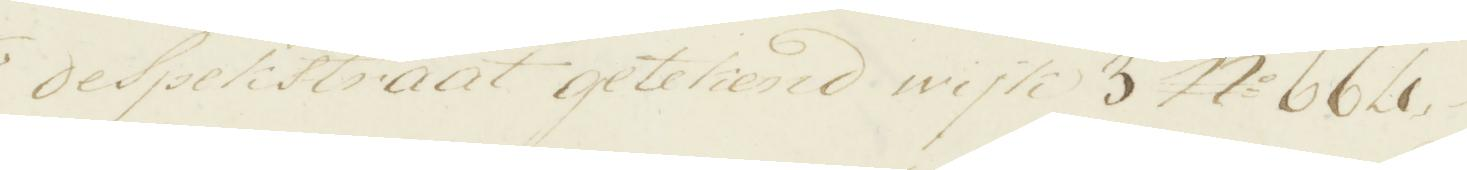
de spekstraat getekend wijk 3 N=o 664.
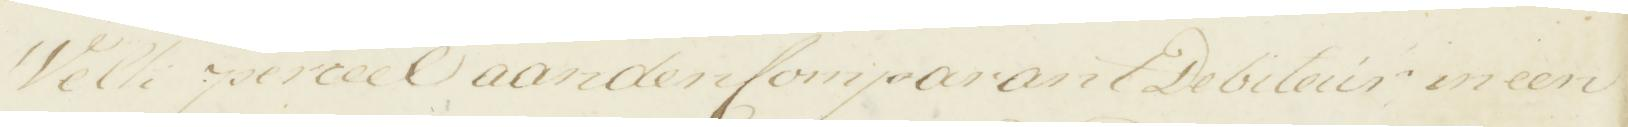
Welk perceel aan den Comparant Debiteur in een
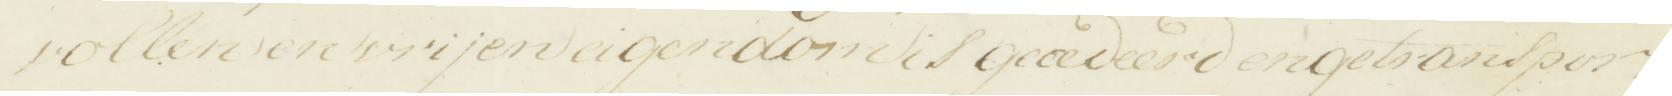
vollen en vrijen eigendom is gecedeerd en getranspor„
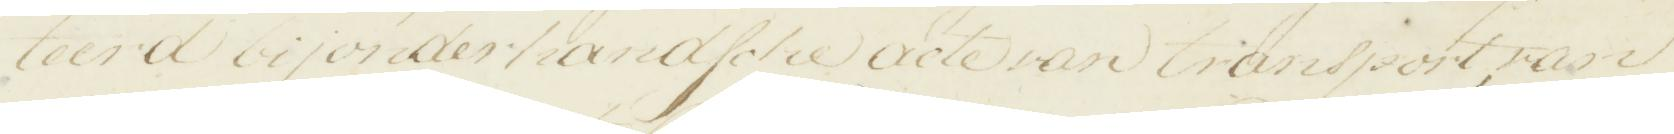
teerd bij onderhandsche acte van transport, van
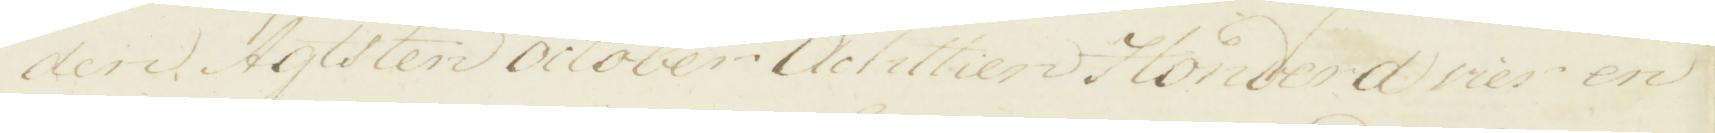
den Agtsten October Achttien Honderd vier en
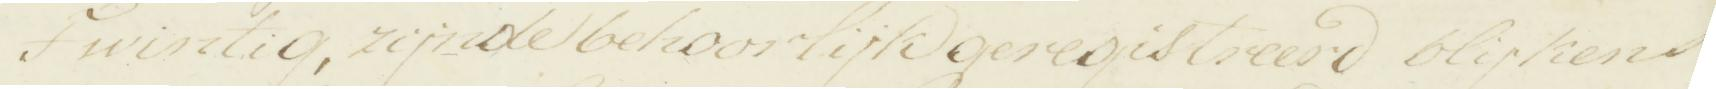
Twintig, zijnde behoorlijk geregistreerd blijkens
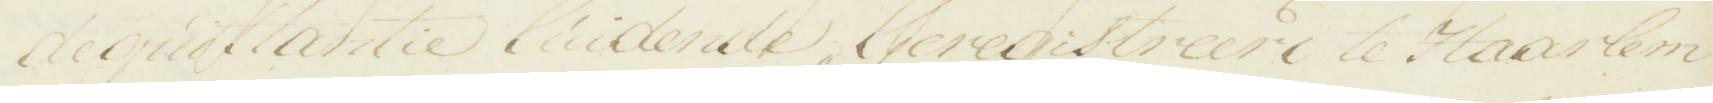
de quitantie luidende „ Geregistreerd te Haarlem
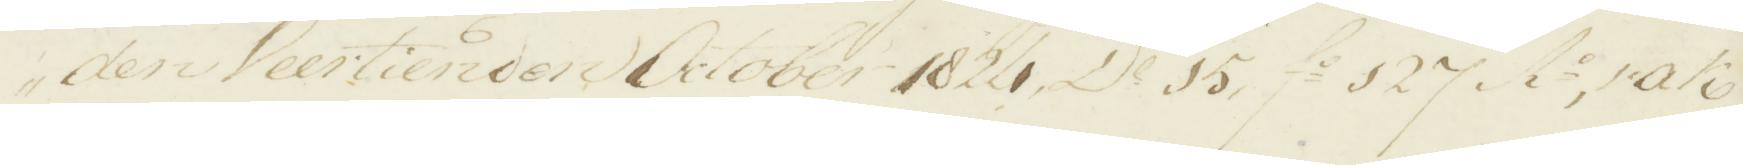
„ den Veertienden October 1824, D-l 15, f=o 127 R=o, vak
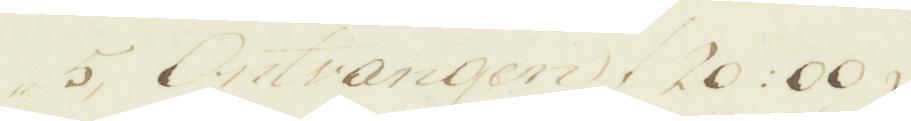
„ 5, Ontvangen ƒ 20: 00
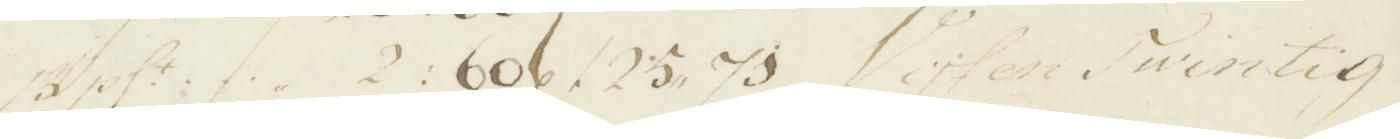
10 pC-t . . . „ 2: 60 ƒ25„ 75 Vijf en Twintig
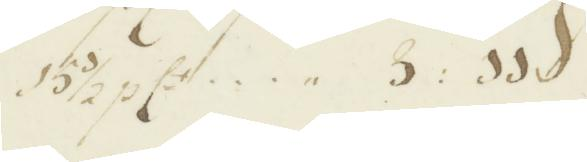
15½ pC-t . . . „ 3: 11
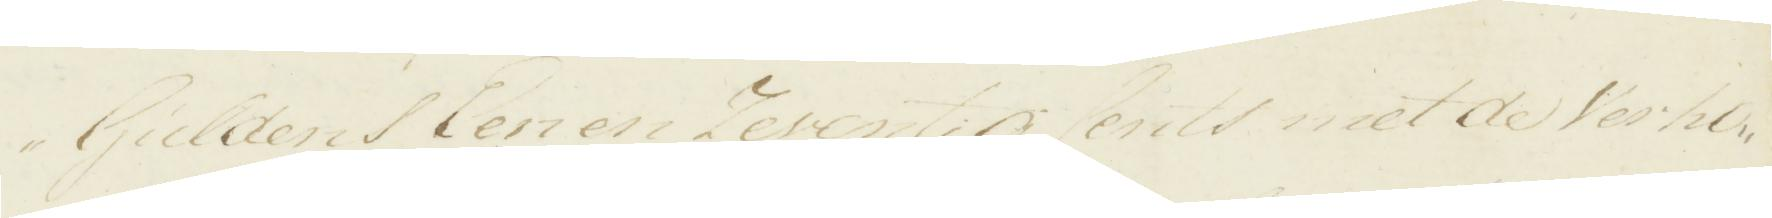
„ Guldens Een en Zeventig Cents met de Verho„
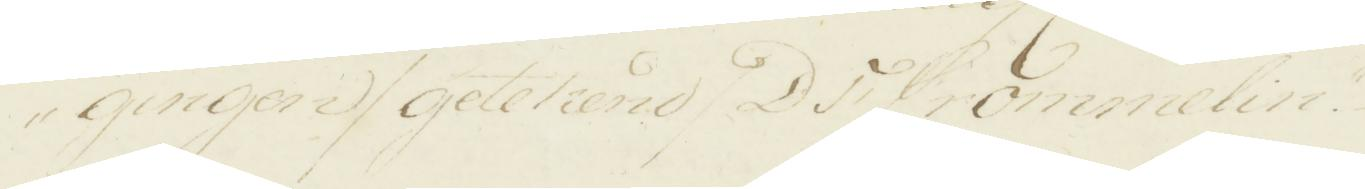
„ gingen /getekend/ DF Crommelin.
